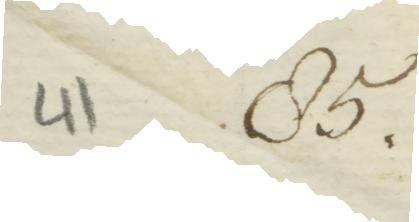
41 85.
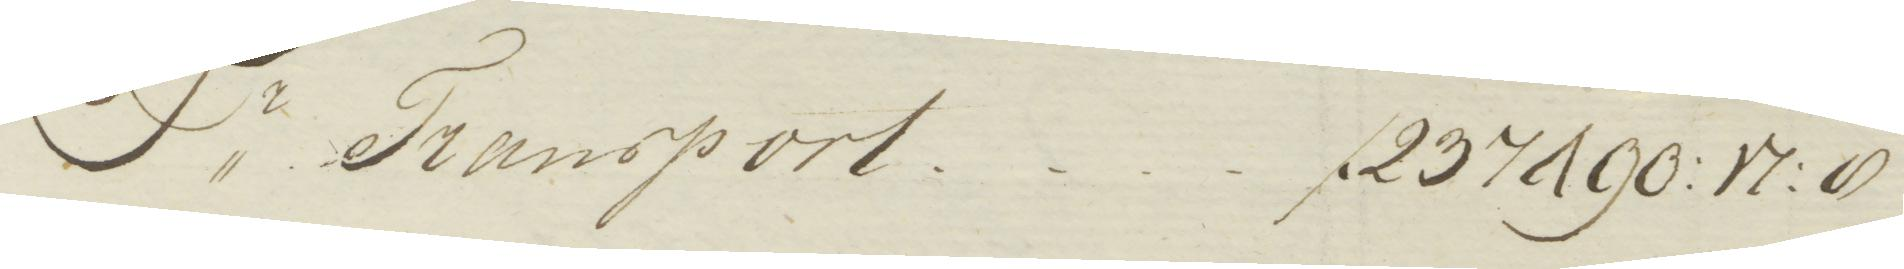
P„r Transport - - - - ƒ237490:17:8
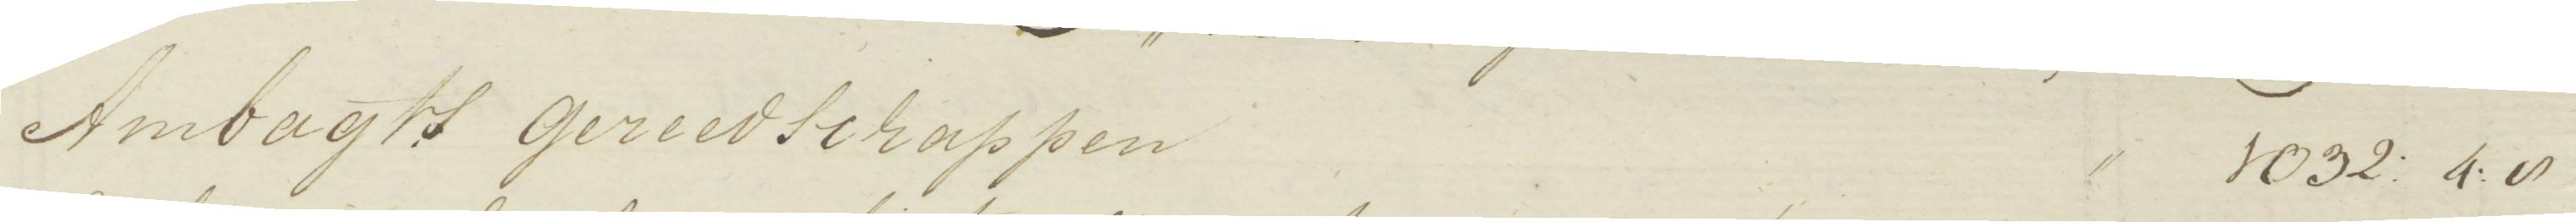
Ambagts gereedschappen „ 1032: 4:8
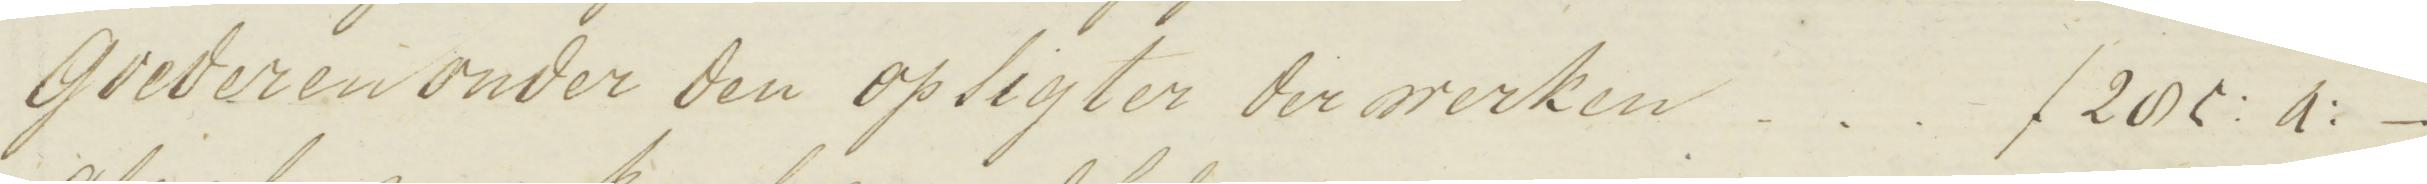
goederen onder den opsigter der werken - . . ƒ285: 4: —
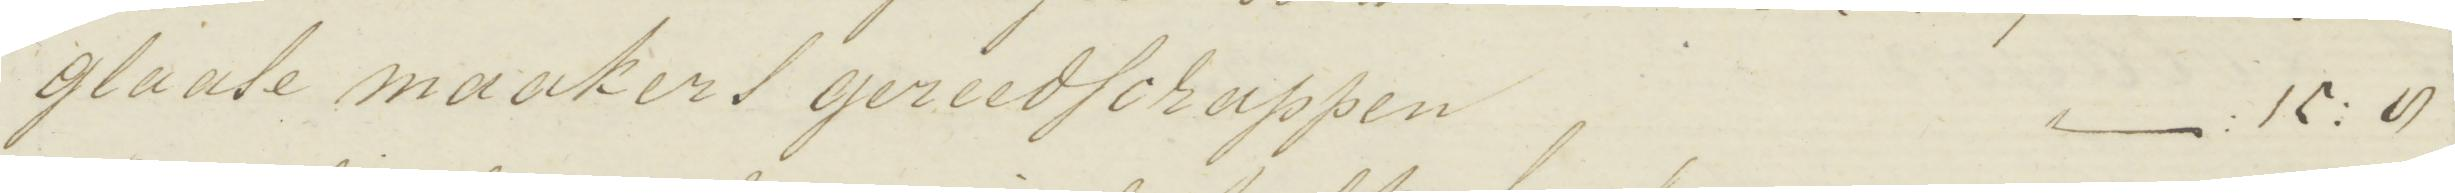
glaase maakers gereedschappen „— : 15: 8
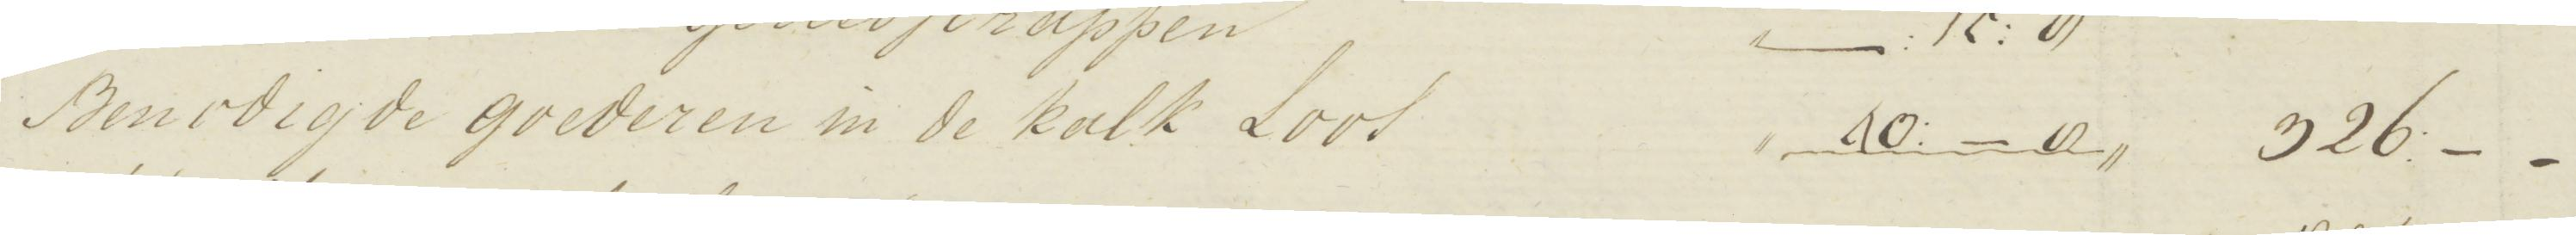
Benodigde goederen in de kalk Loos „ 40: — 8 „ 326: — —
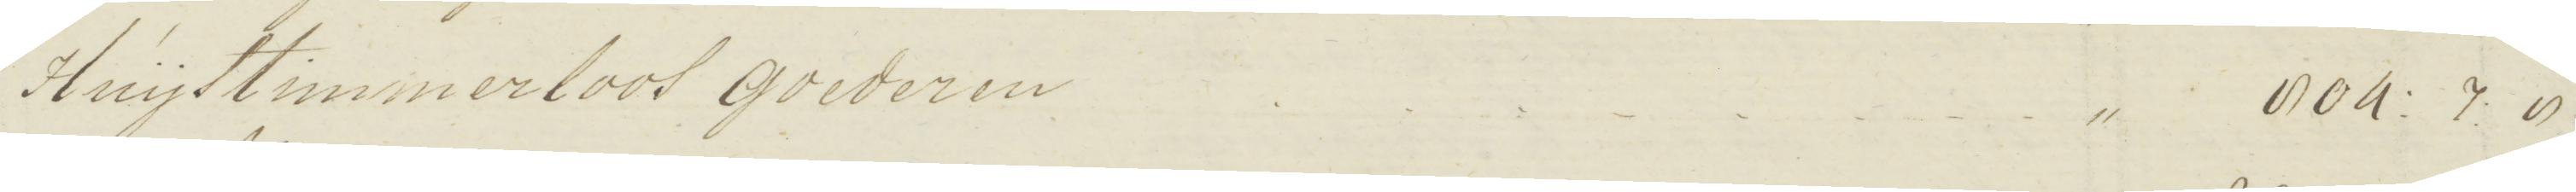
Huijstimmerloos goederen . . . - - - - - „ 804: 7: 8
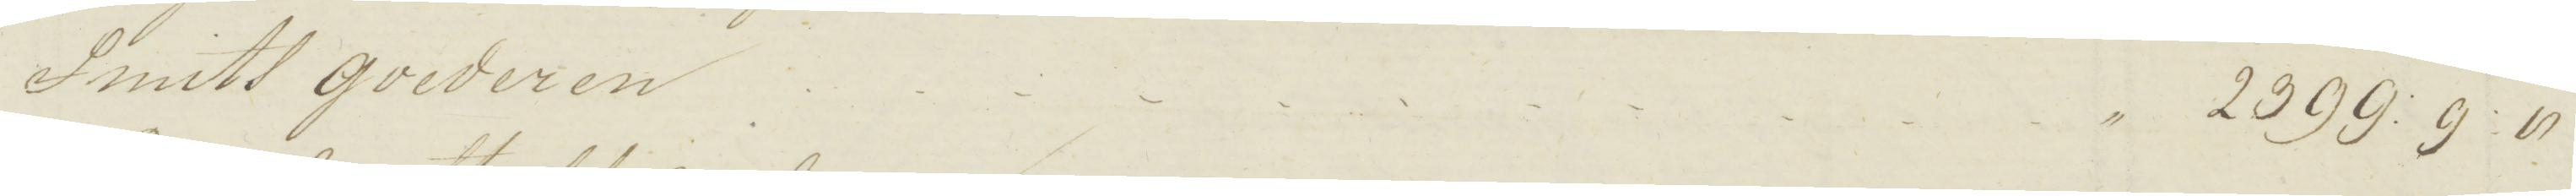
Smits goederen - - - - - - - - - - - „ 2399: 9: 8
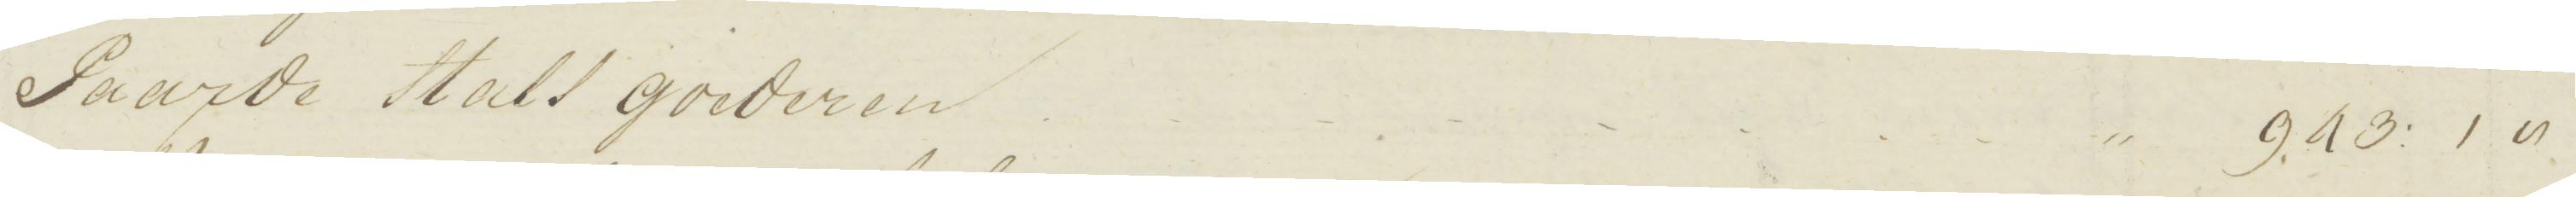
Paarde stals goederen . - - - - . - „ 943: 1 8
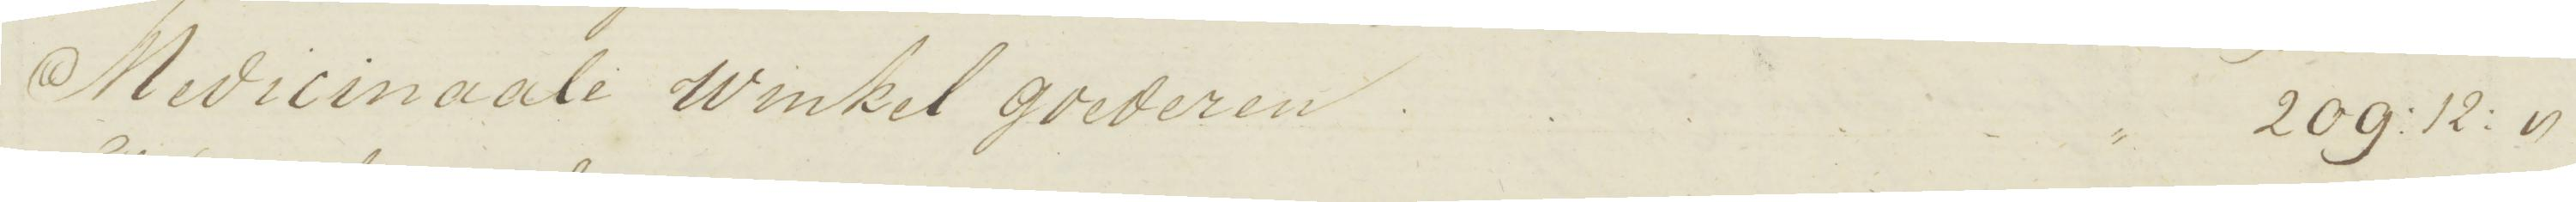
Medicinaale winkel goederen . . . . - „ 209:12:8
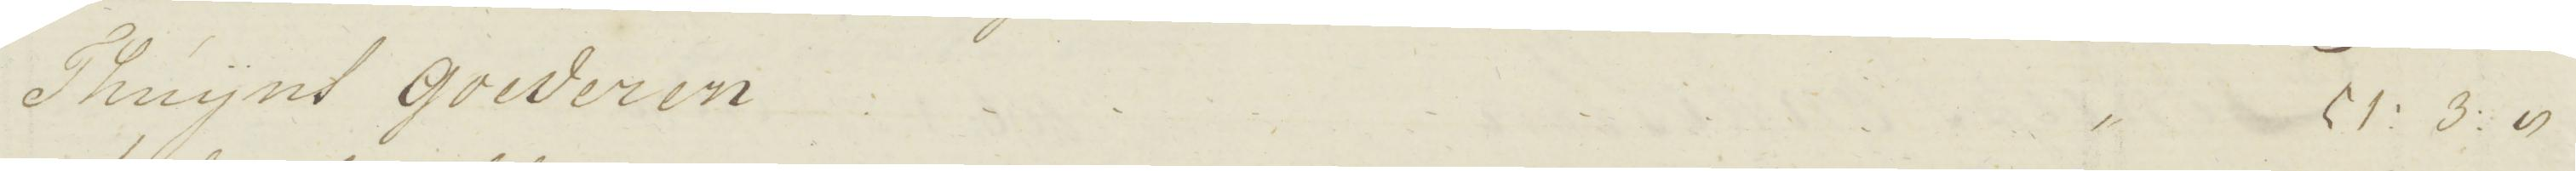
Thuijns goederen : - - - - - . - . „ 51: 3: 8
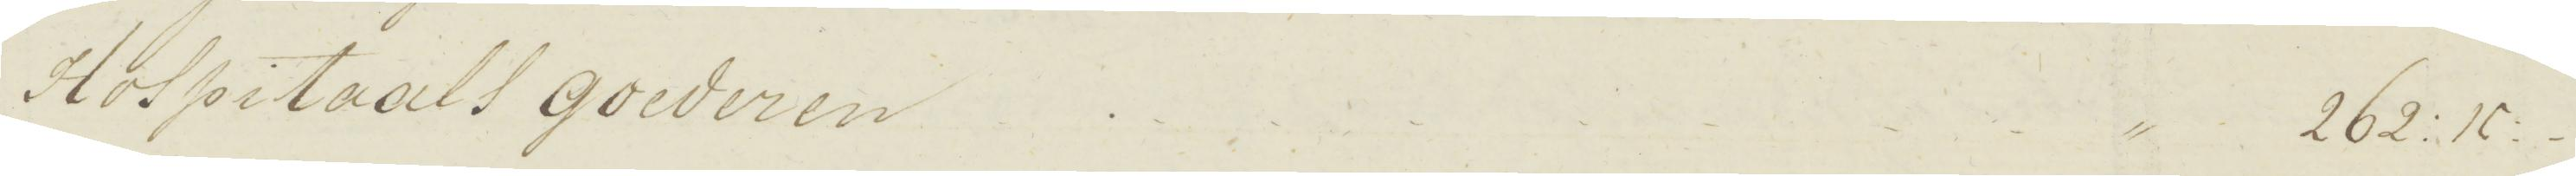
Hospitaals goederen . - - - - - - - „ 262: 15: -
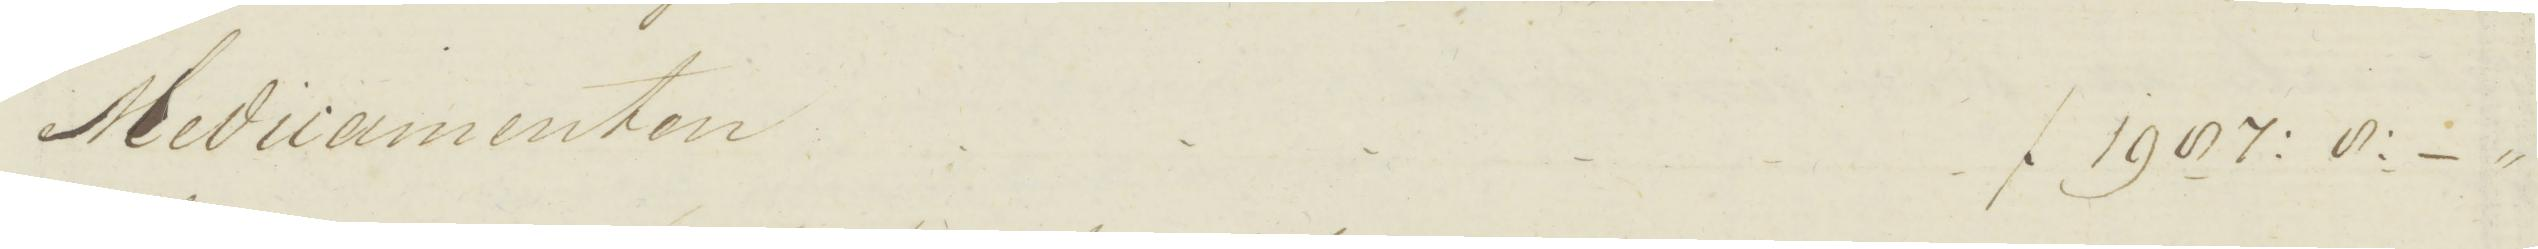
Medicamenten - - - - - - ƒ1987: 8: — „
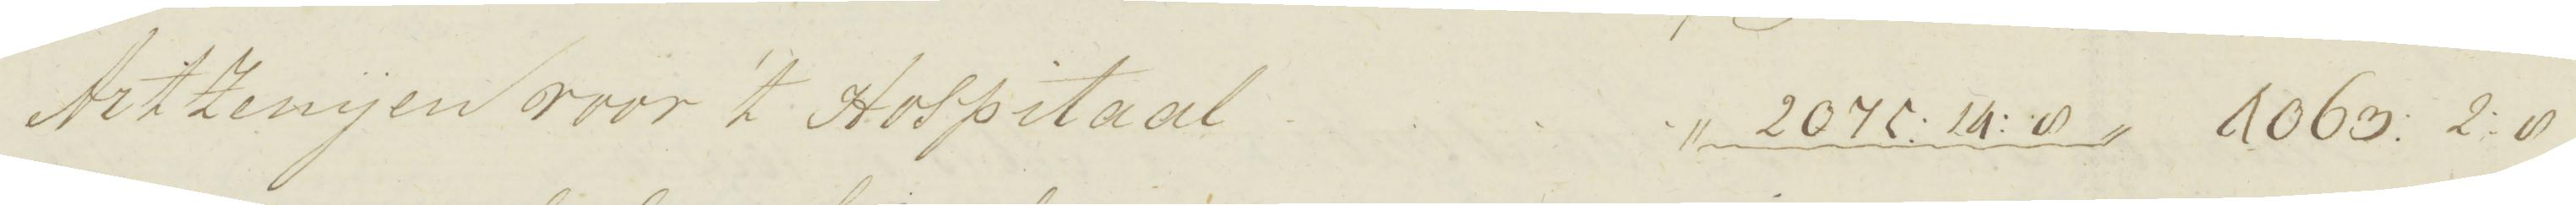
Artzenijen voor ’t Hospitaal . . . . „ 2075: 14: 8 „ 4063: 2: 8
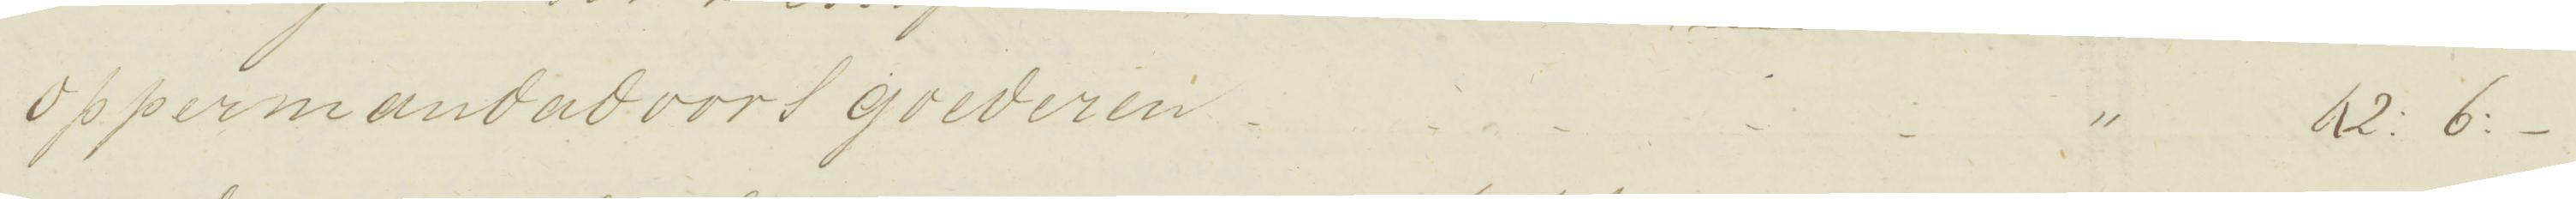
oppermandadoors goederen - - - - - „ 42: 6: —
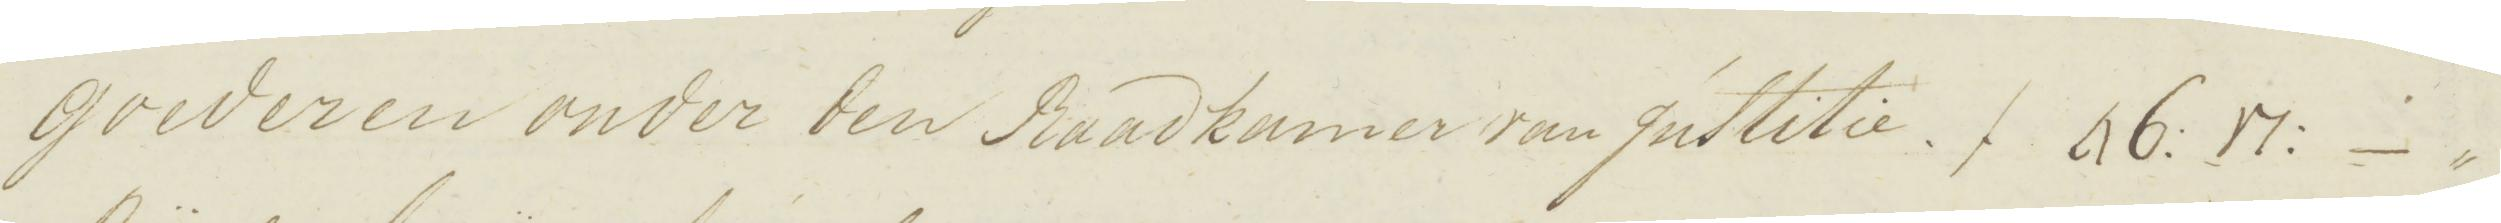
goederen onder den Raadkamer van justitie . ƒ 46: 17: — „
